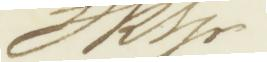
IKSjr
